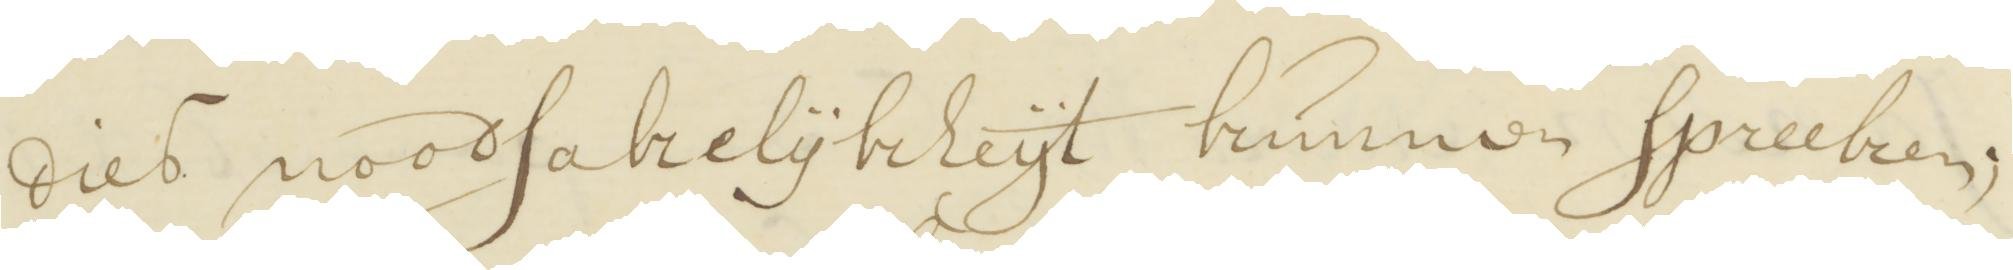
dies noodsakelijkheijt kunnen spreeken;
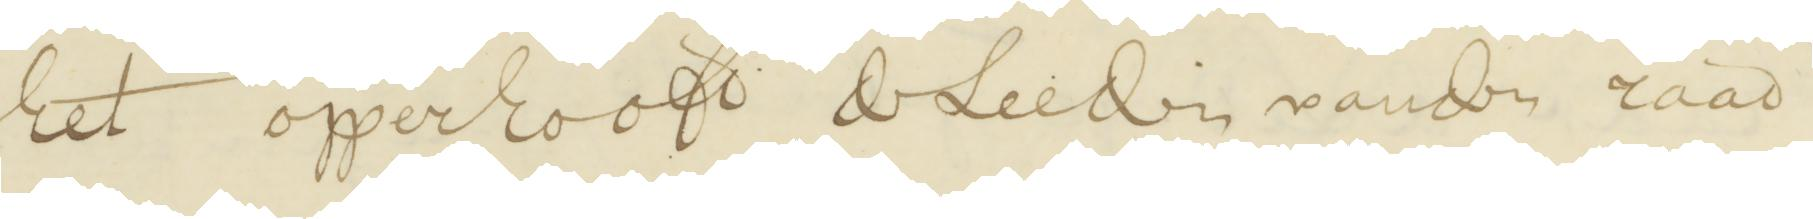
het opperhoofd deleeden vanden raad
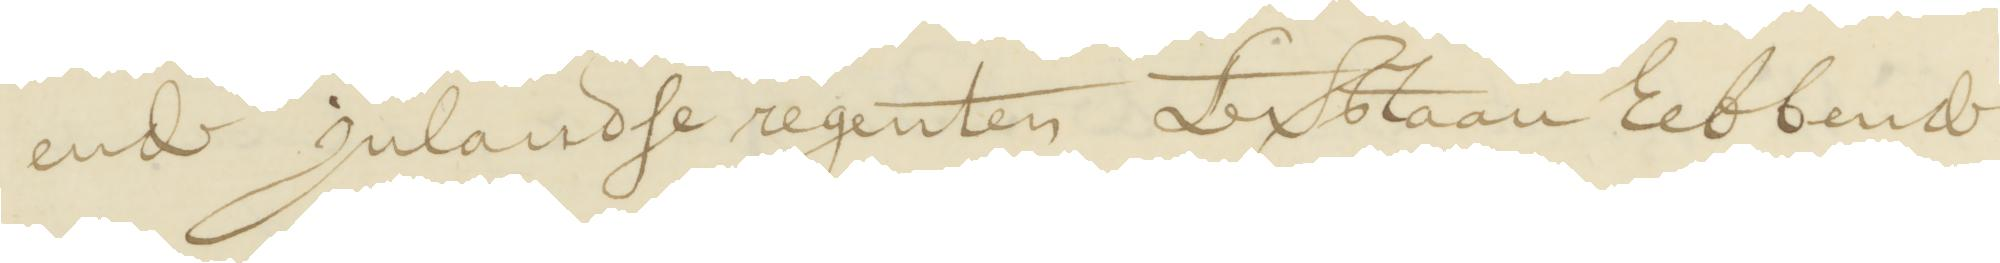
ende jnlandse regenten teverstaan hebbende
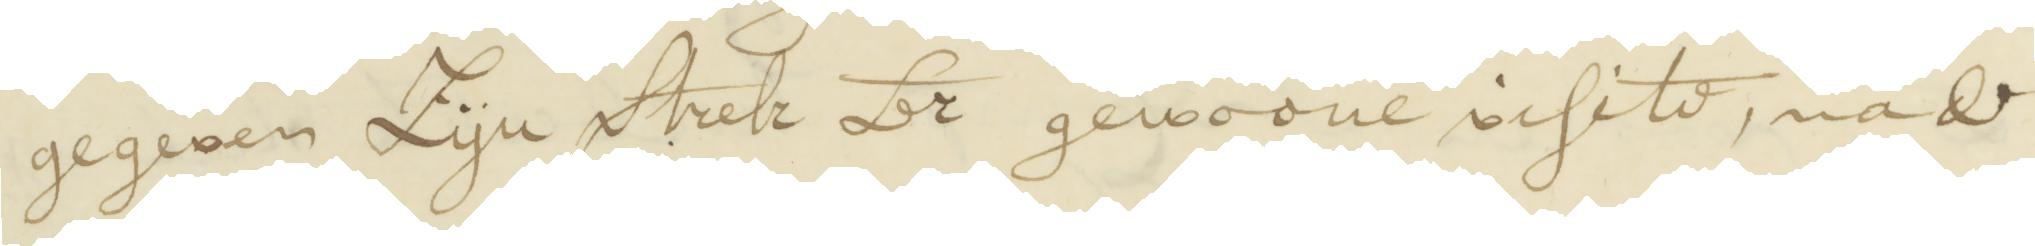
gegeven zijn vertrek ter gewoone visite, na de
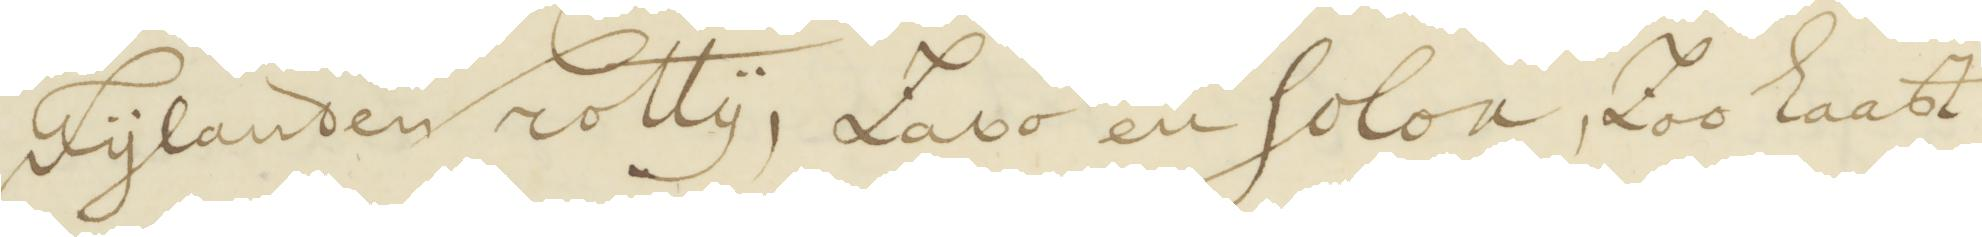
Eijlanden rottij, zavo en solor, zoo haast
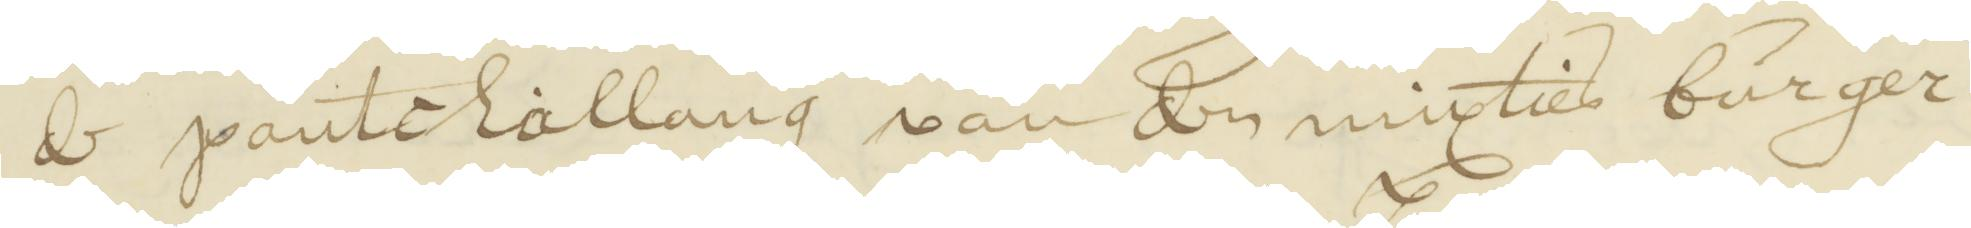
de pantchallang van den mixties burger
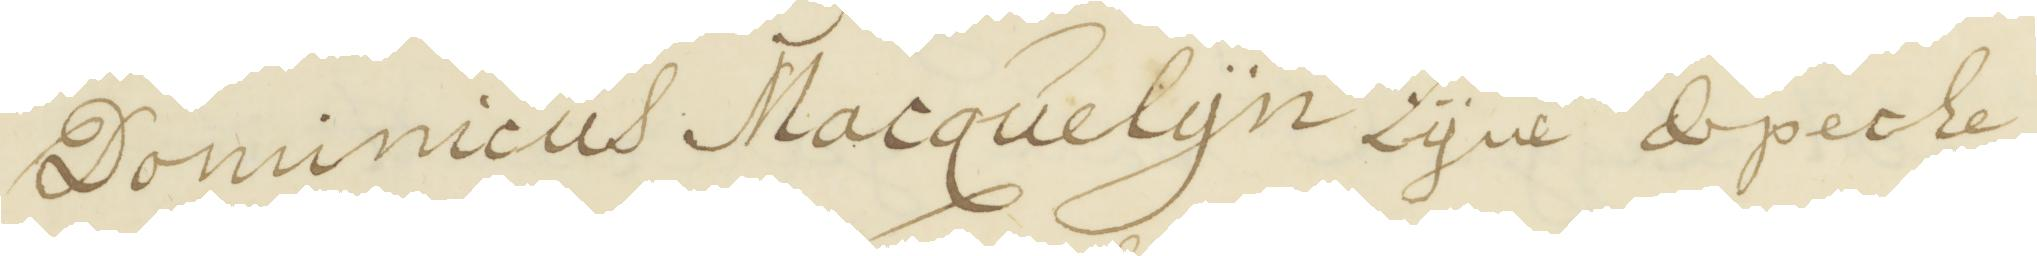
Dominicus Macquelijn zijne depeche
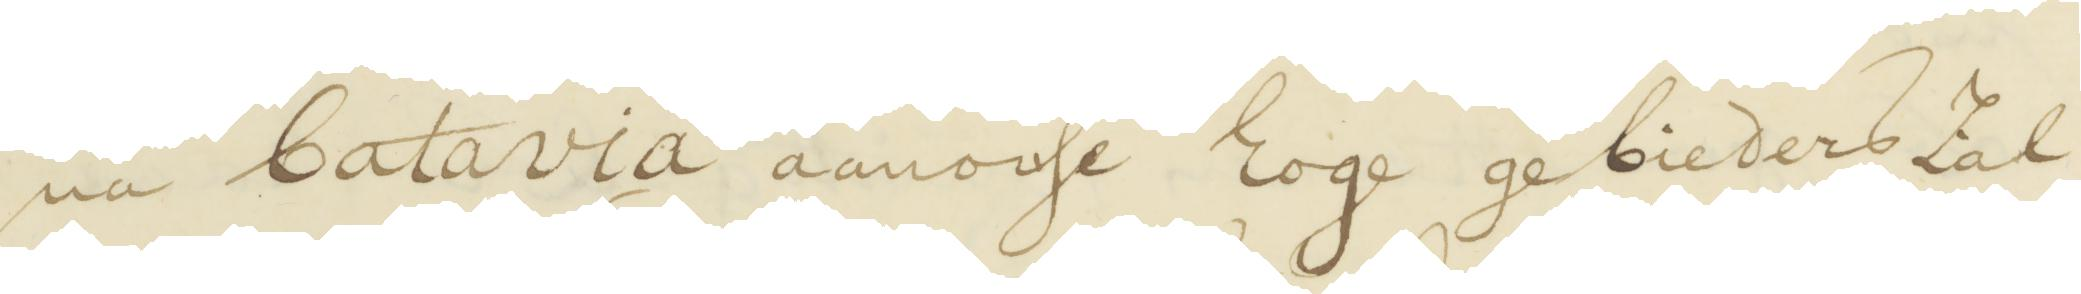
na batavia aanonse hoge gebieders zal
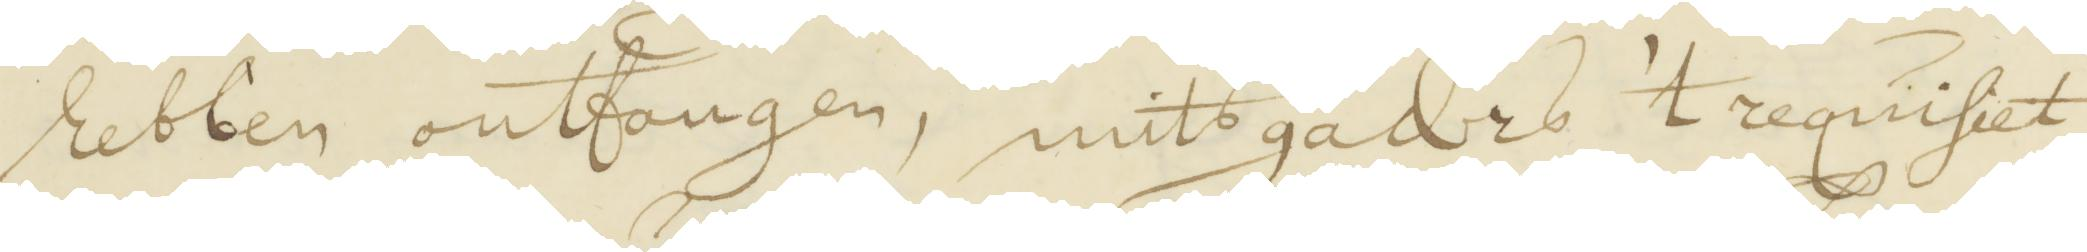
hebben ontfangen, mitsgaders ’t requisiet
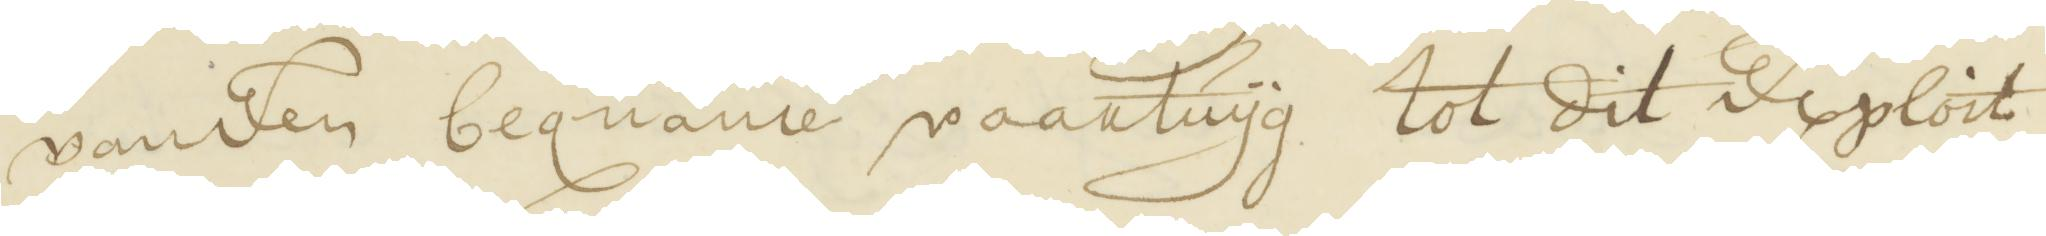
vanEen bequame vaartuijg tot dit Exploit
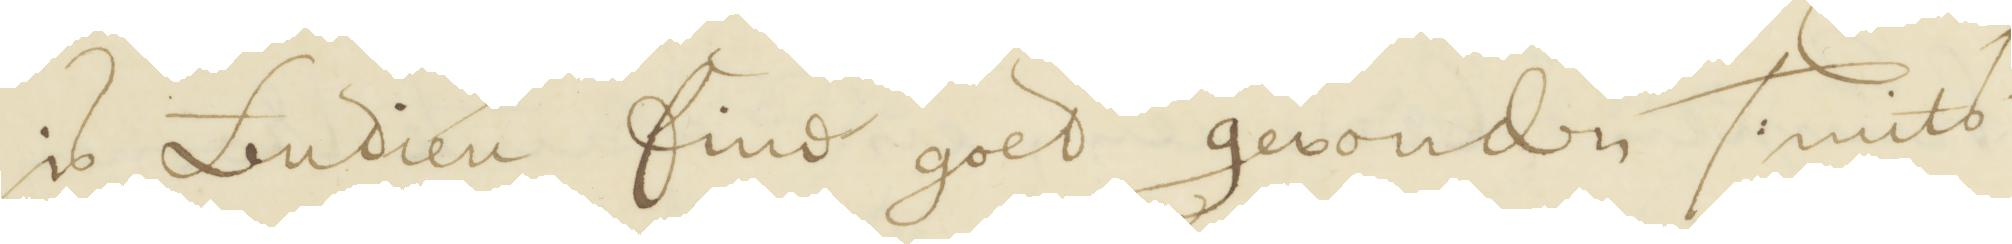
is tendien fine goed gevonden /:mits
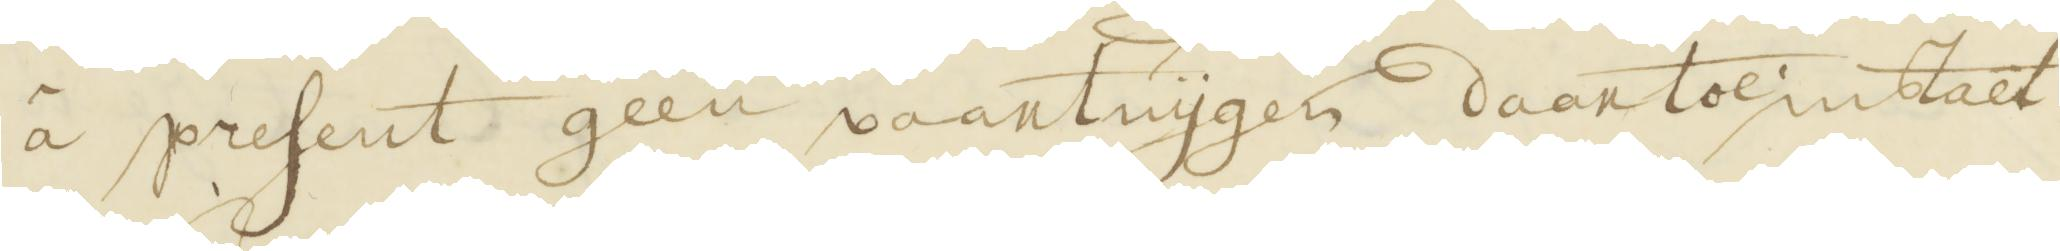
â present geen vaartuijgen daartoe instaet
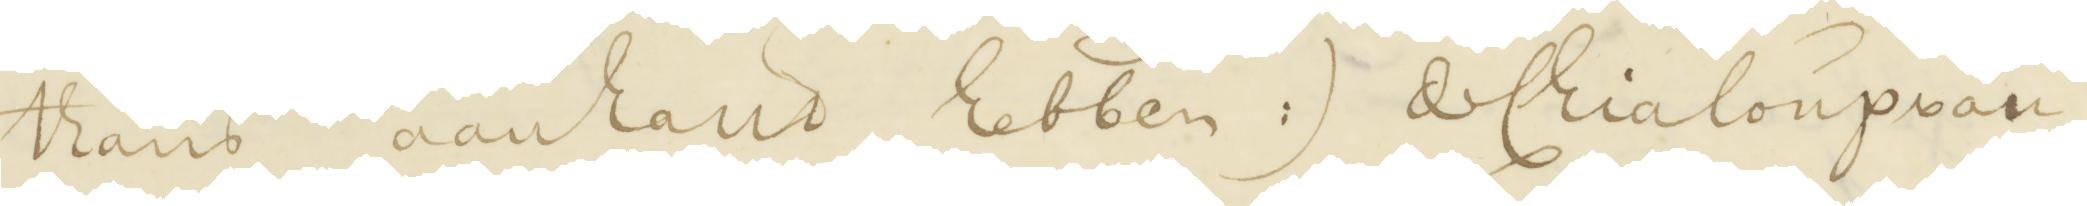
thans aanhand hebben:) deChialoup van
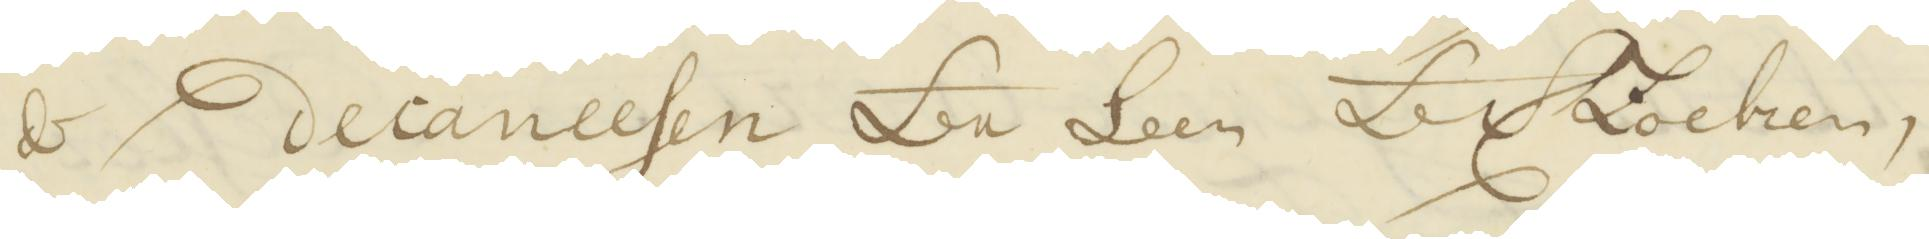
de decaneesen ter leen te verzoeken,
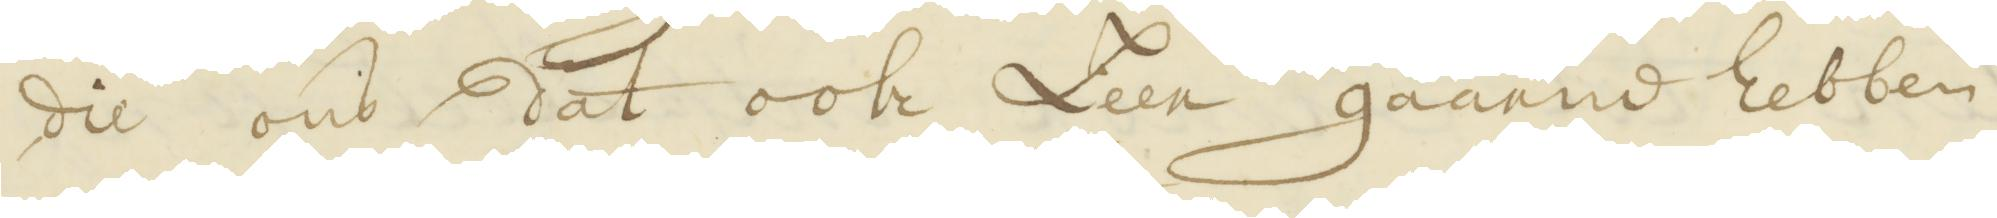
die ons dat ook zeer gaarne hebben
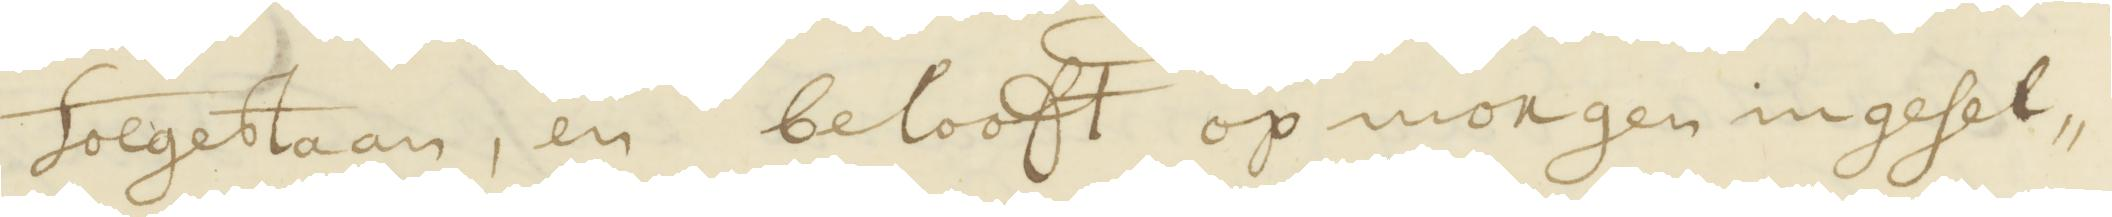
toegestaan, en belooft op morgen ingesel„
